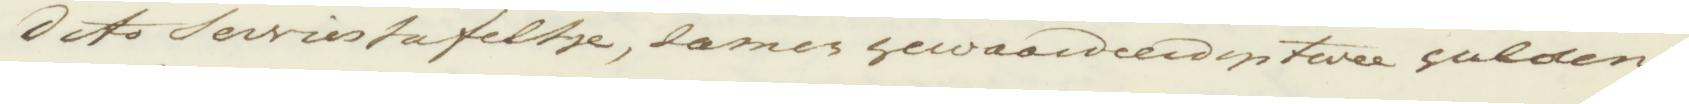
dito serviestafeltje, zamen gewaardeerd op twee gulden
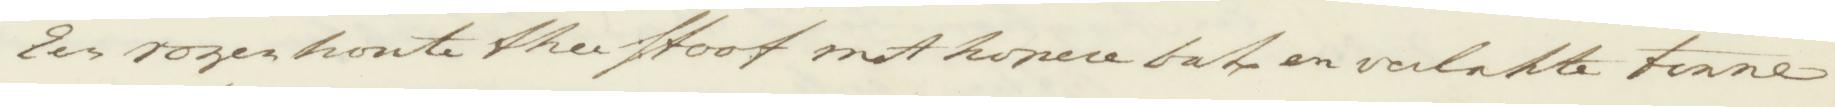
Een rozenhoute theestoof met kopere bak en verlakte tinne
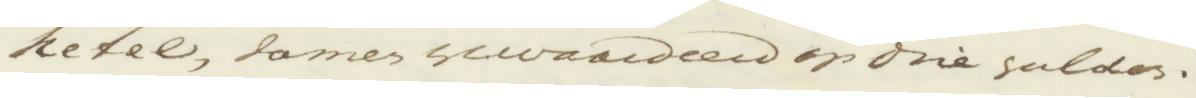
ketel, zamen gewaardeerd op drie gulden.
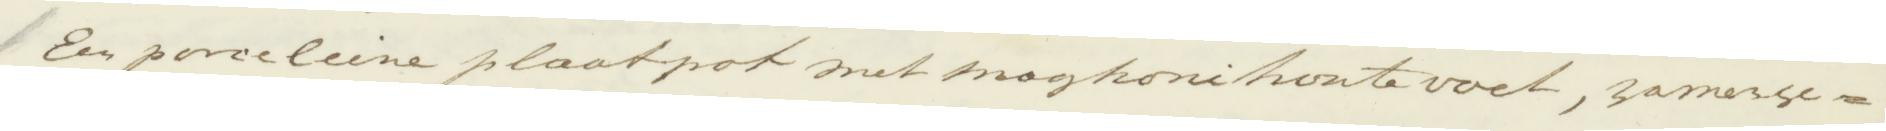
Een porceleine plaatpot met maghonihoute voet, zamen ge=
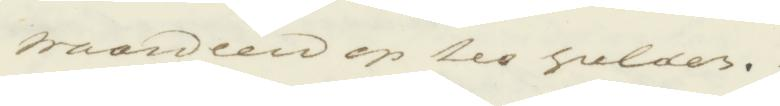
waardeerd op zes gulden.
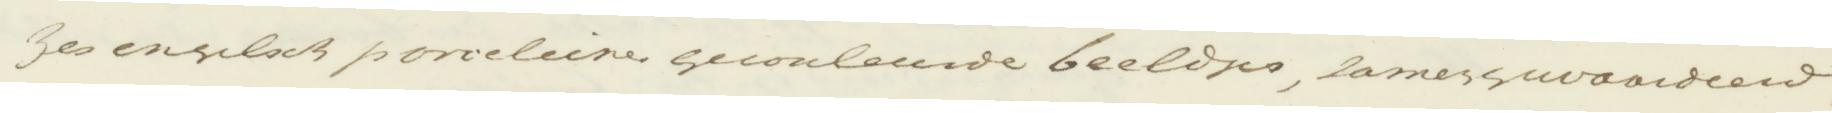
Zes engelsch porceleine gecouleurde beeldjes, zamen gewaardeerd
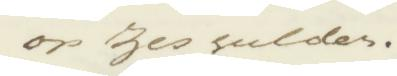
op Zes gulden.
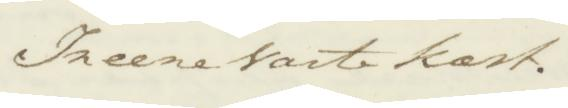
In eene vaste kast.
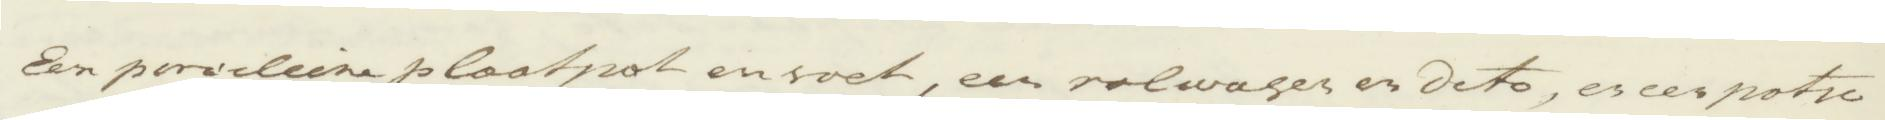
Een porceleine plaatpot en voet, een volwagen en dito, en een potje
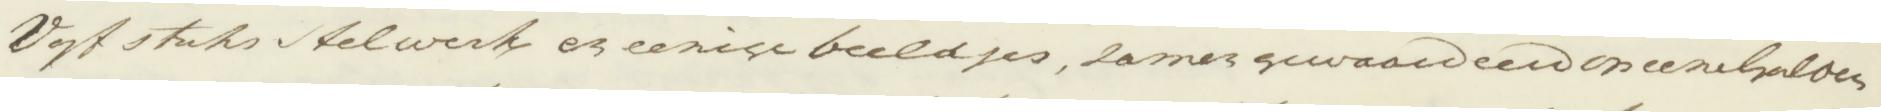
Vyf stuks stelwerk en eenige beeldjes, zamen gewaardeerd op eene Gulden
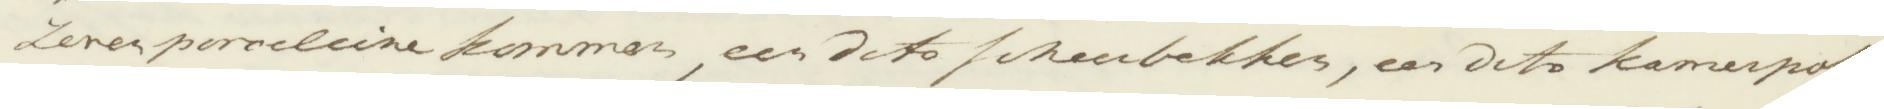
Zeven porceleine kommen, een dito scheerbekken, een dito kamerpot
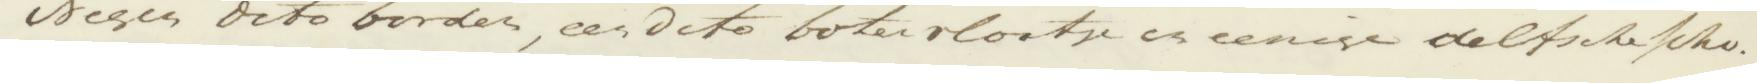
Negen dito borden, een dito botervlootje en eenige delfsche scho.
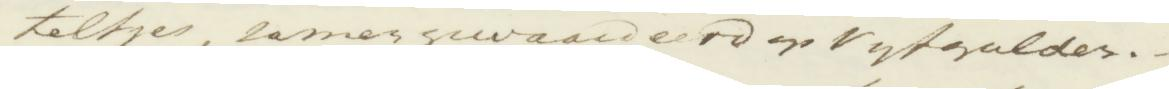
teltjes, zamen gewaardeerd op Vyf gulden.
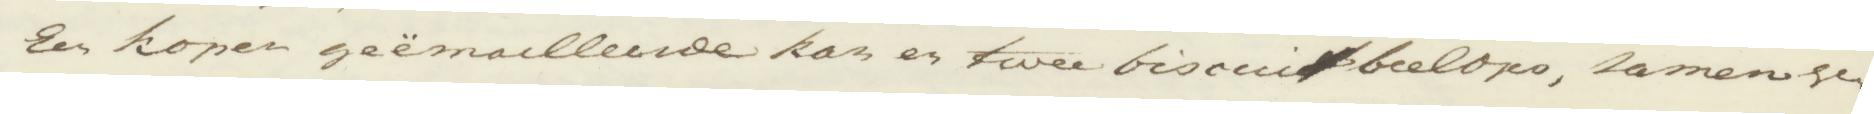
Een koper geëmailleerde kan en twee biscuit beeldjes, zamen ge
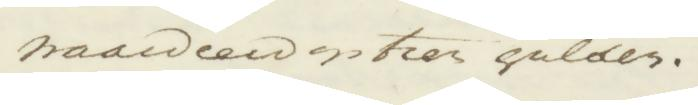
waardeerd op tien gulden.
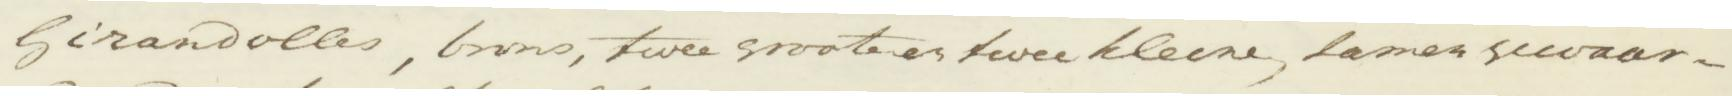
Girandolles, brons, twee groote en twee kleine, zamen gewaar
